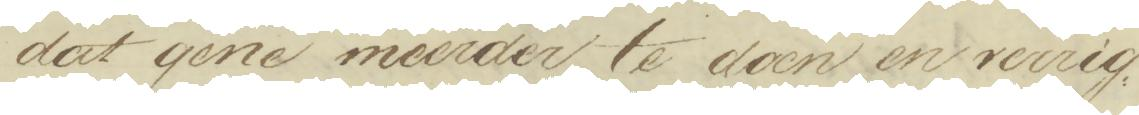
dat gene meerder te doen en verrig„
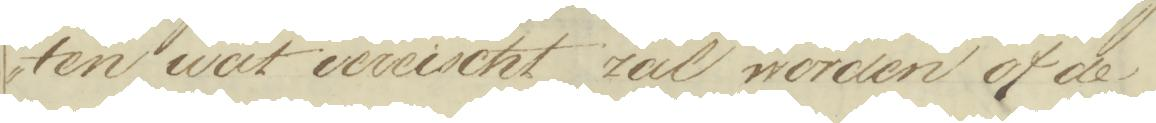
„ten wat vereischt zal worden of de
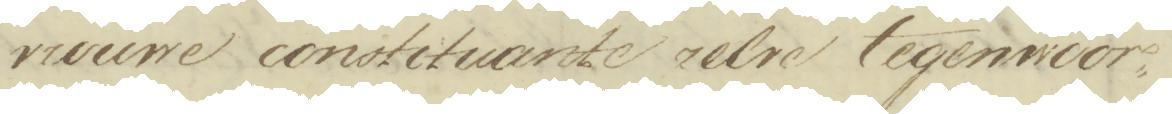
vrouwe constituante zelve tegenwoor„
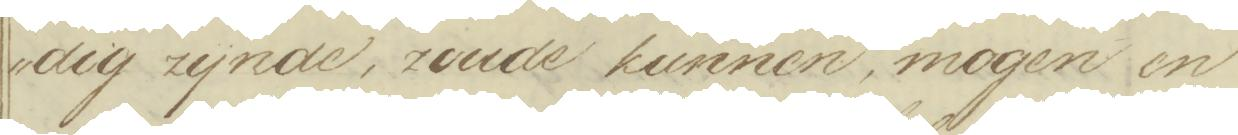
„dig zijnde, zoude kunnen, mogen en
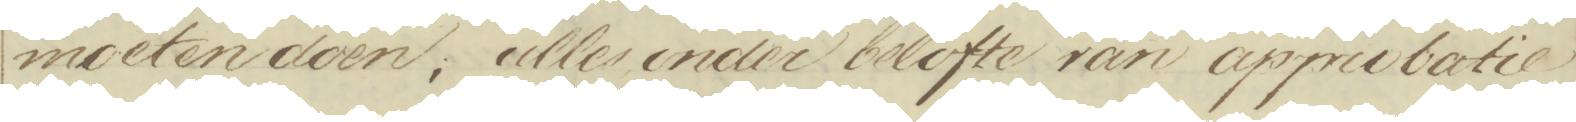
moeten doen; alles onder belofte van approbatie
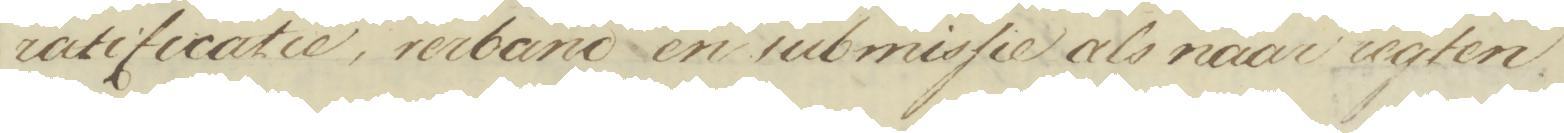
ratificatie, verband en submissie als naar regten
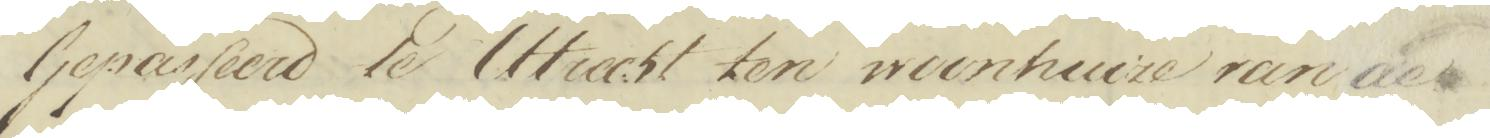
Gepasseerd te Utrecht ten woonhuize van de
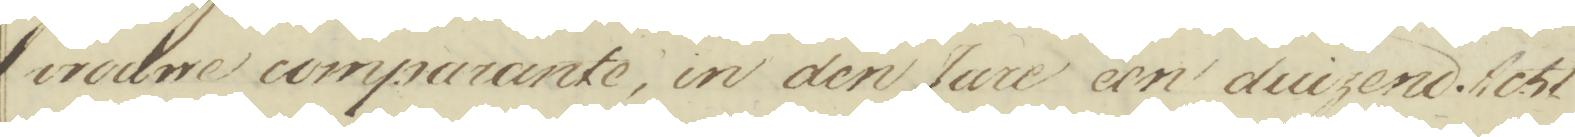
vrouwe comparante, in den Jare een duizend Acht
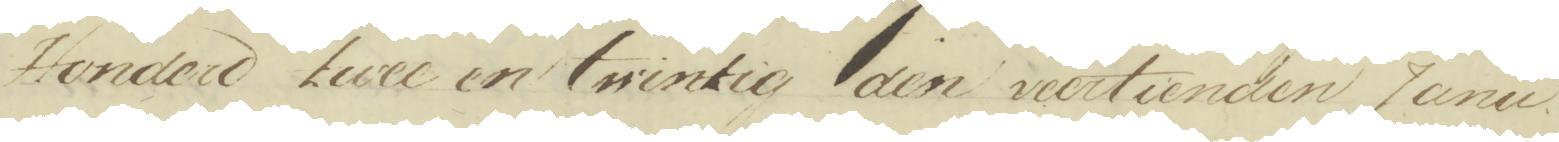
Honderd twee en twintig den veertienden Janu
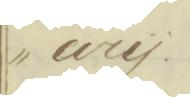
„ arij.
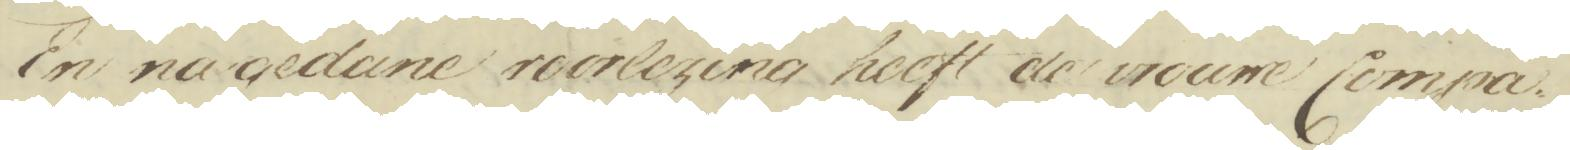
En na gedane voorlezing heeft de vrouwe Compa„
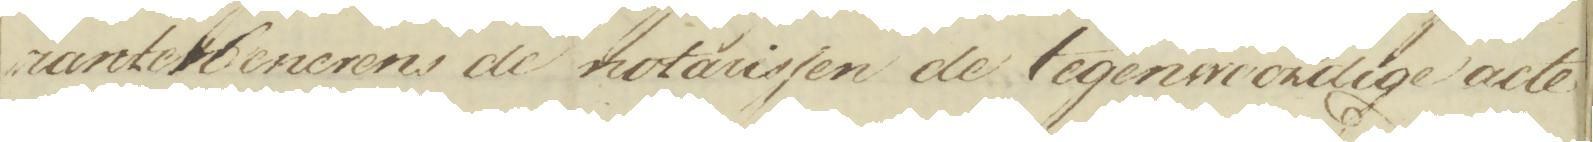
„rante benevens de notarissen de tegenwoordige acte
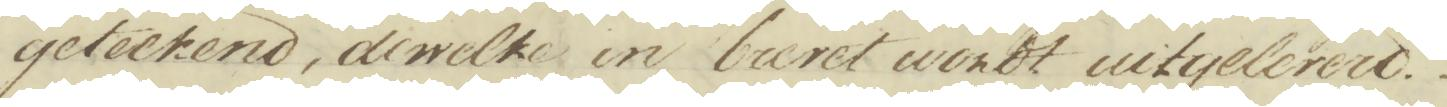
geteekend, dewelke in brevet wordt uitgeleverd.
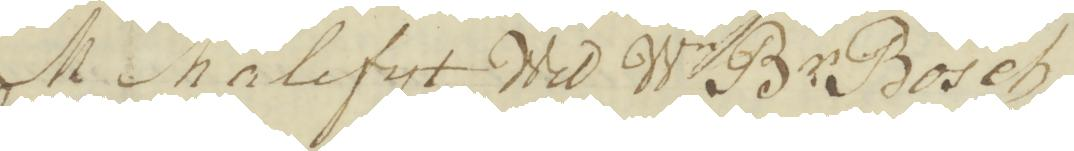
M Malefijt Wel Wn B.r Bosch
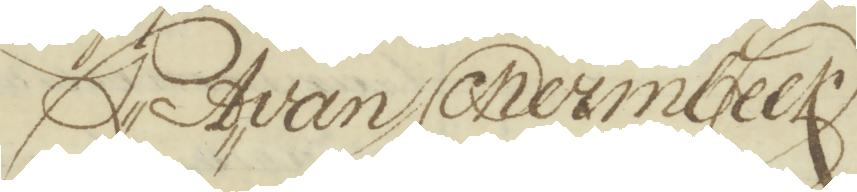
P„ A„ van Schermbeek
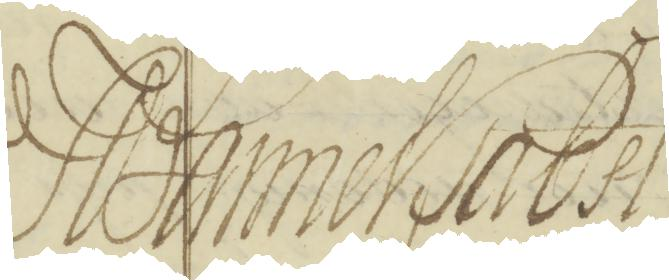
Johannes Pabst
